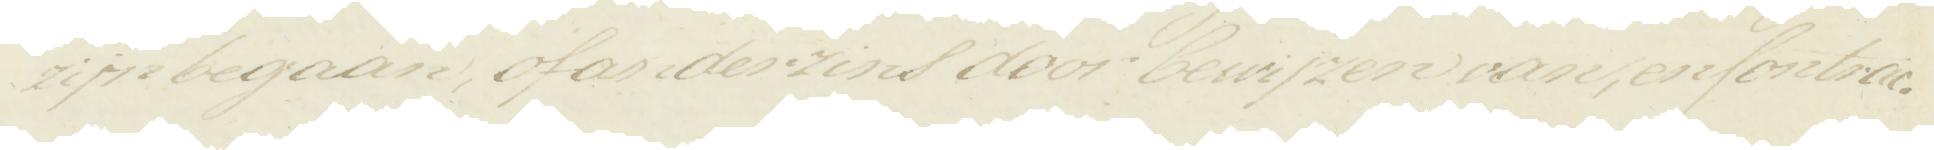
zijn begaan, of anderzins door bewijzen van, en contrac„
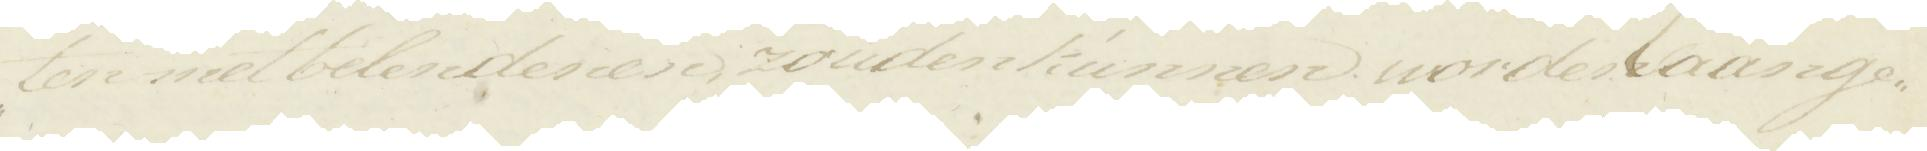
ten met belendenen, zouden kunnen worden aange„
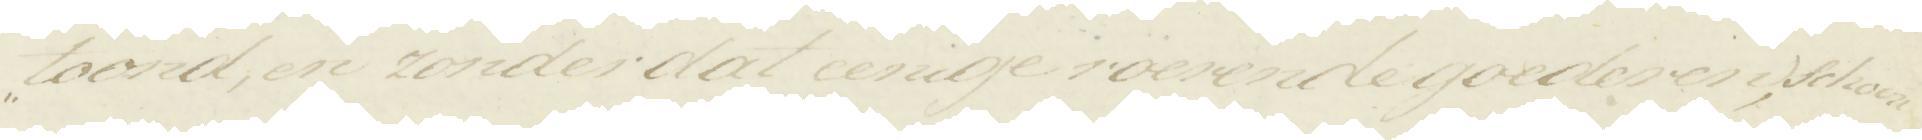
toond, en zonder dat eenige voerende goederen schoon
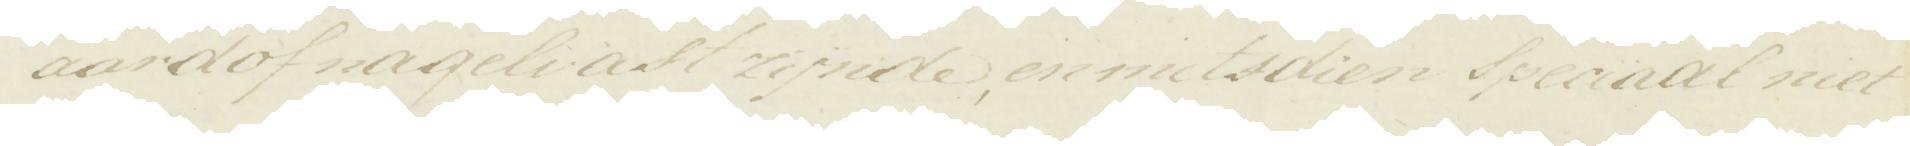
aard of nageliast zijnde, en mitsdien speciaal niet
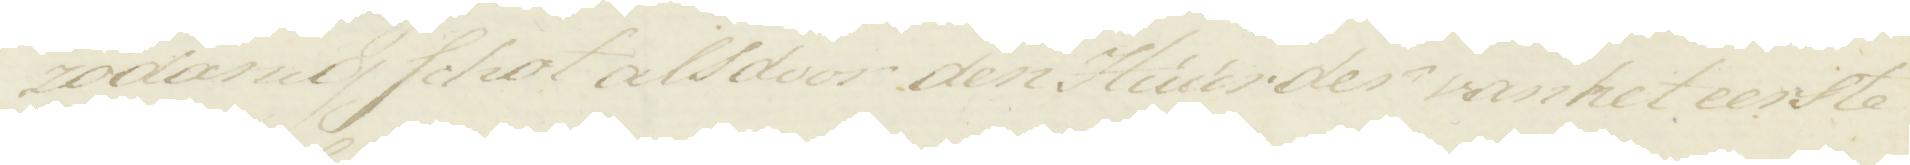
zodanig schot als door den Huurder van het eerste
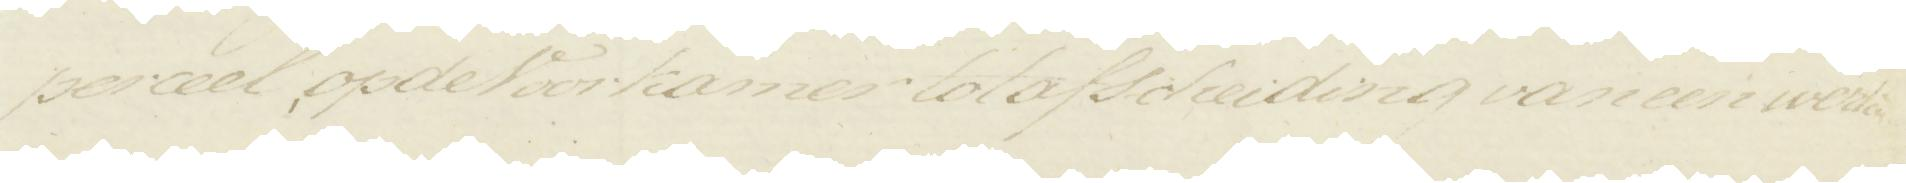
perceel op de voorkamer tot afscheiding van een werk
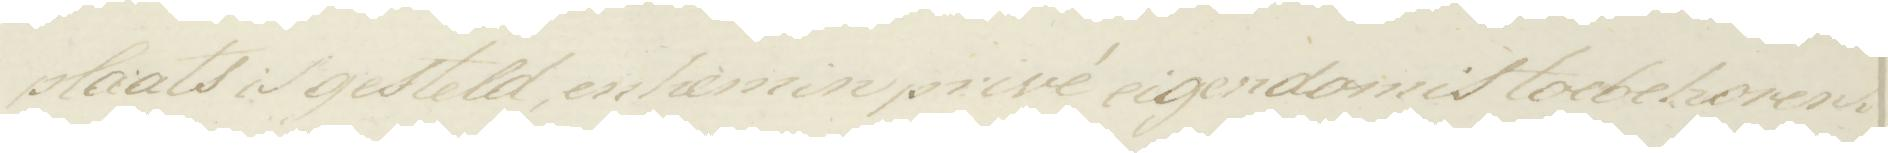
plaats is gesteld, en hem in privé eigendom is toebehoren,
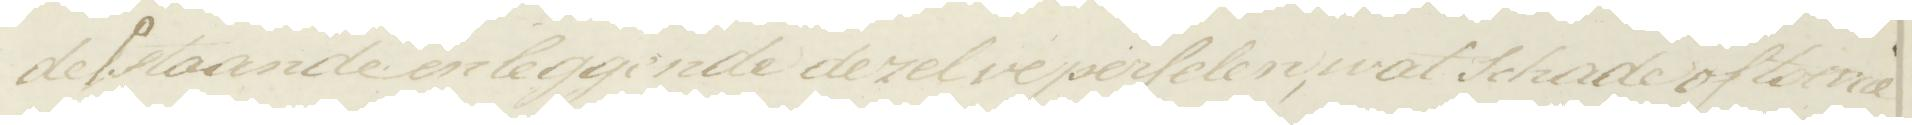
de ¶ staande en leggende dezelve perselen, wat schade of toeval
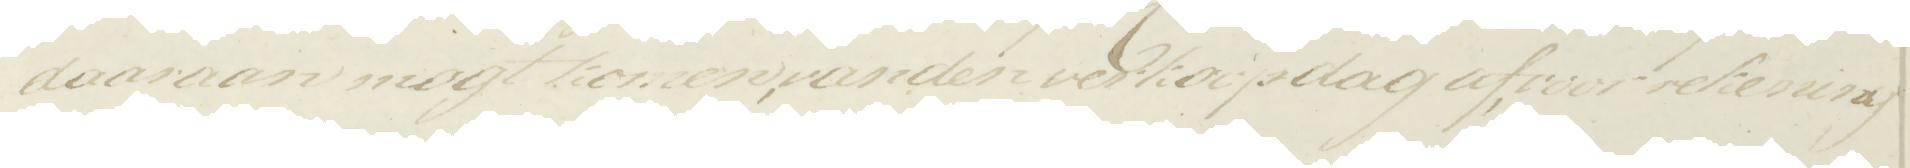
daaraan mogt komen, van den verkoopdag af, voor rekening
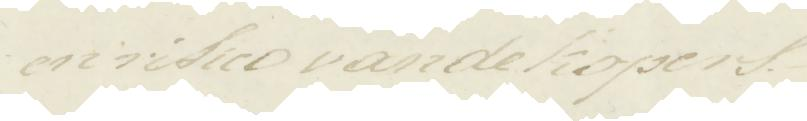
en risico van de kopers.
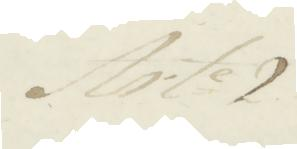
Artl 2.
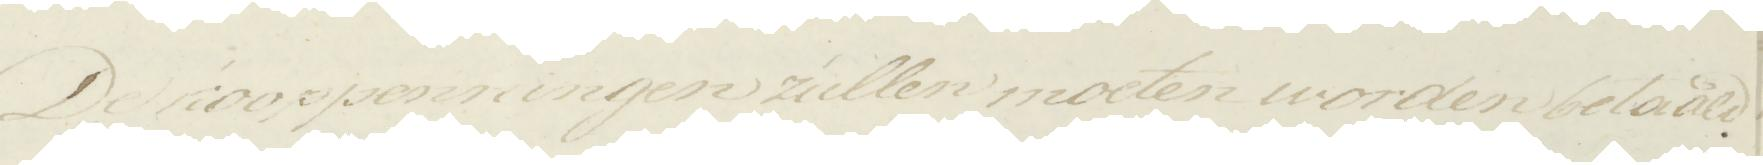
De kooppenningen zullen moeten worden betaald
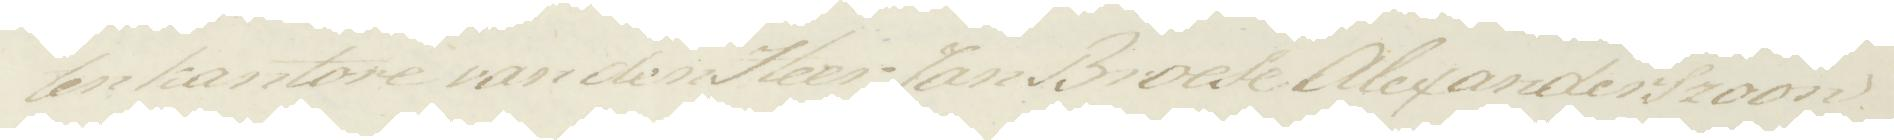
ten kantore van den Heer Jan Broese Alexanderszoon.
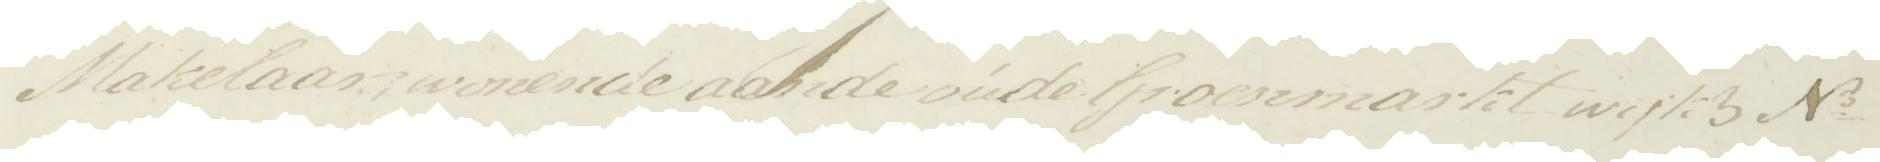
Makelaar, wonende aande oude Groenmarkt wijk N=o
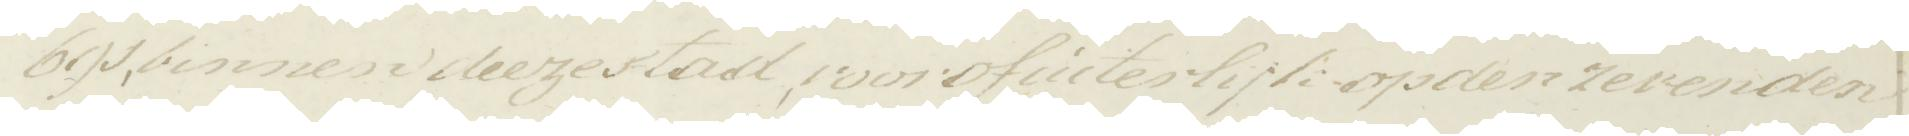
691, binnen deeze stadt, voor of uiterlijk op den zevenden
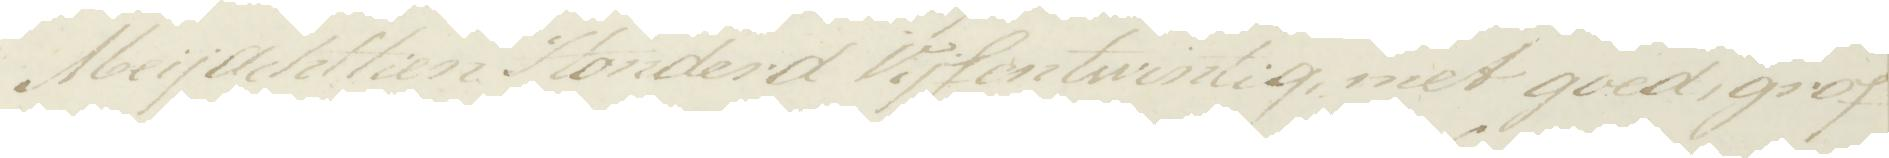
Meij achttien Honderd Vyfentwintig, met goed, grof
